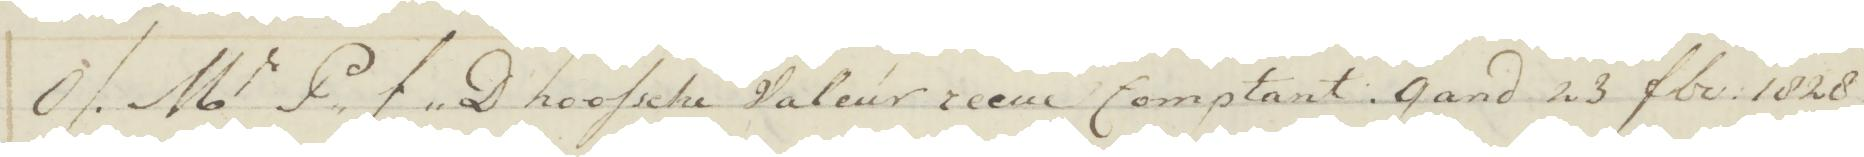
O /. Mr P„ f „ D hoofsche Valeur reene Comptant: 9 and 23 fbr: 1828
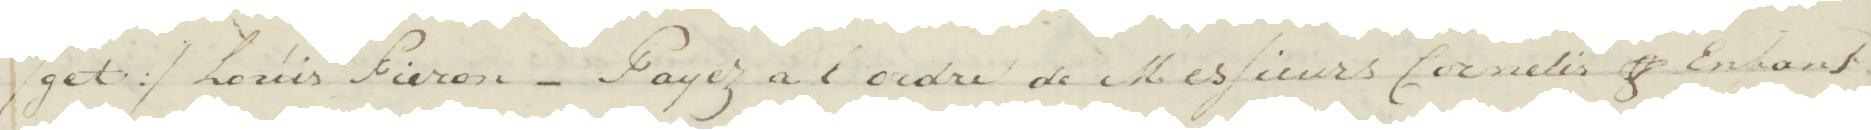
/get:/ Louis Pieron – Payez a l ordre de Messieurs Cornelis & En hans
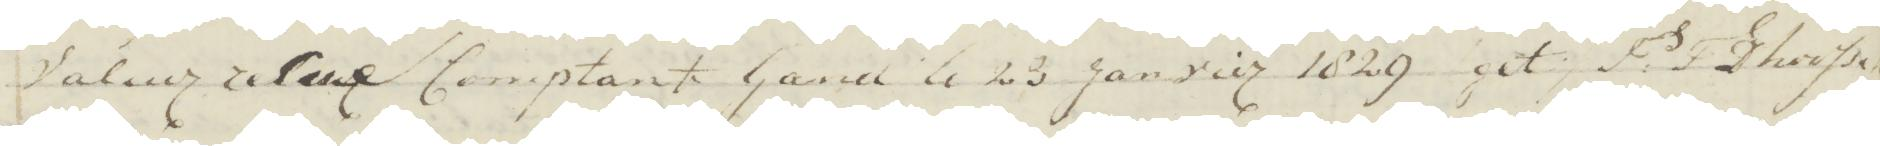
Valeur zelve Comptant Gand le 23 Janvier 1829 /get/ F:s en D hoofse
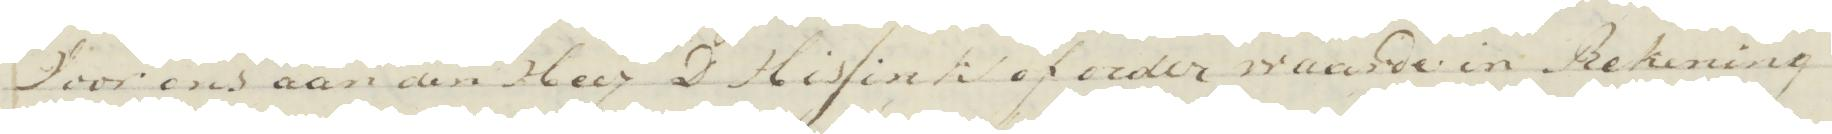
Voorens aan den Heer D Hissink of order waarde in Rekening
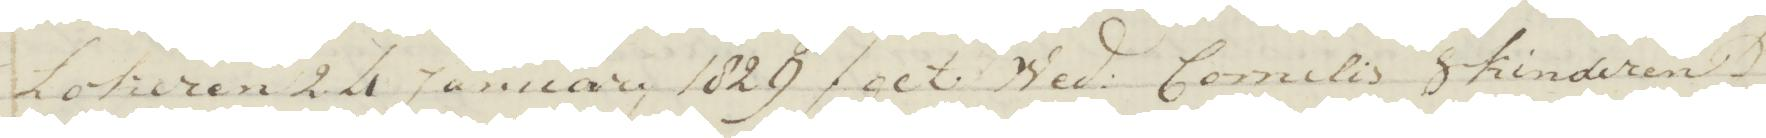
Lokeren 24 January 1829 /get/ Wed: Cornelis & kinderen
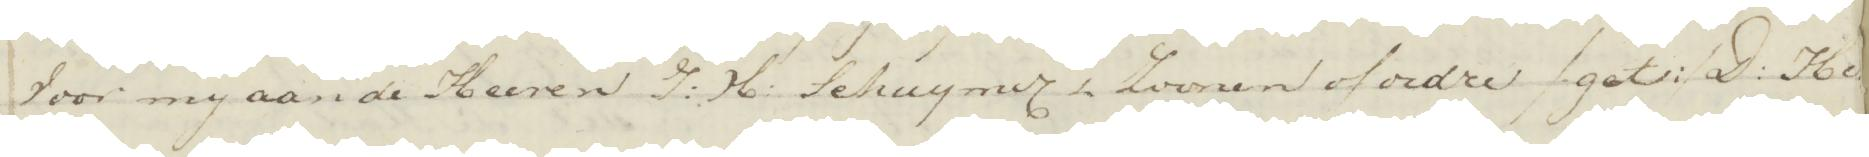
Voor my aan de Heeren J: H: Schuymer & Zoonen of ordres /get:/ D: Hi
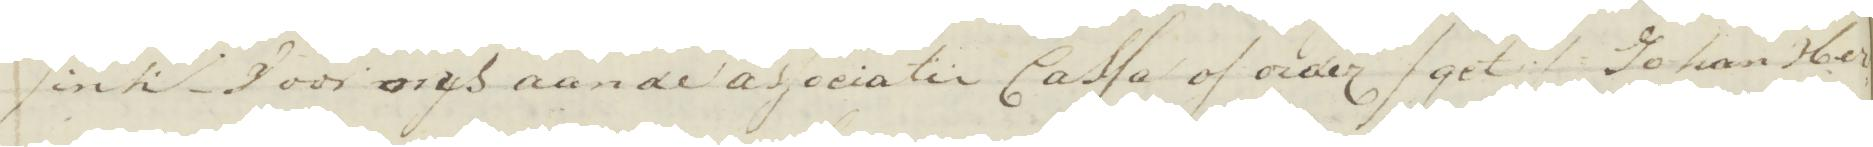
sink Voor ons aan de associatie Cassa of order /get:/ Iohan Her
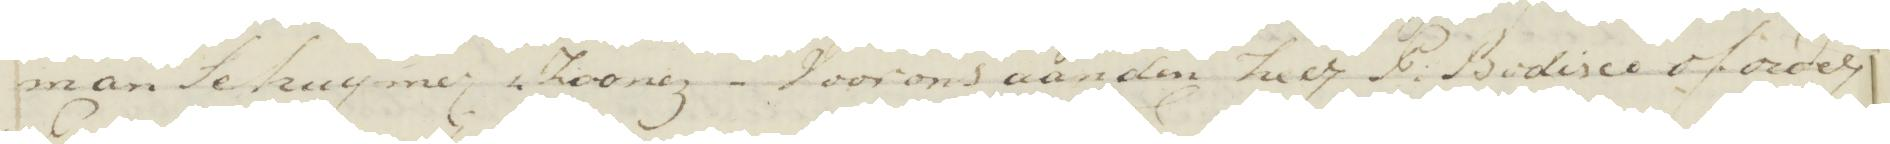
man schuymer & Zoonen - Voor ons aan den heer P: Bodisco of order
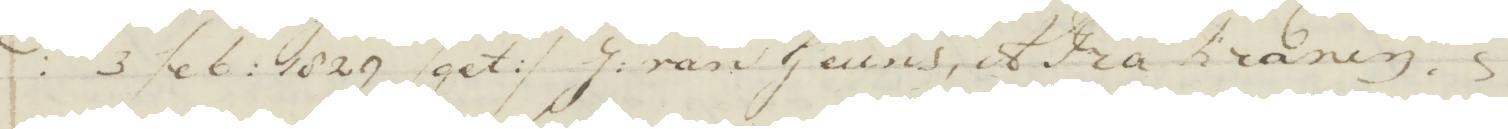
: 3 feb: 1829 /get:/ J: van Geuns, A Frakranen.
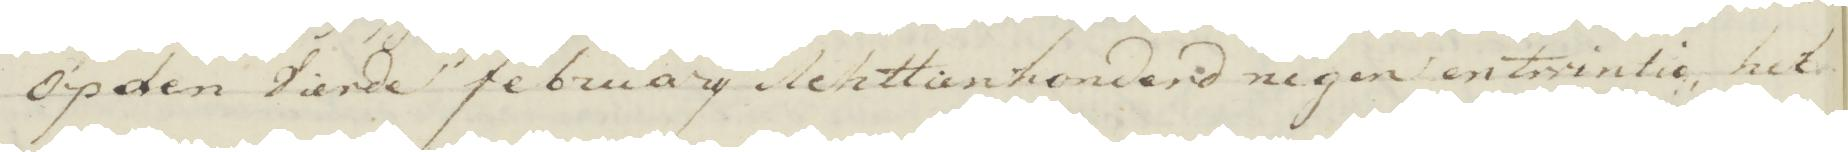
Op den Vierde february Achttienhonderd negen en twintig, heb
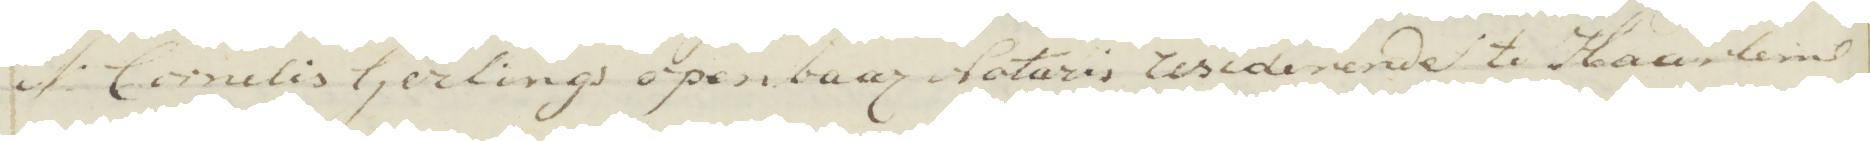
ik Cornelis Gerlings openbaar Notaris residerende te Haarlem
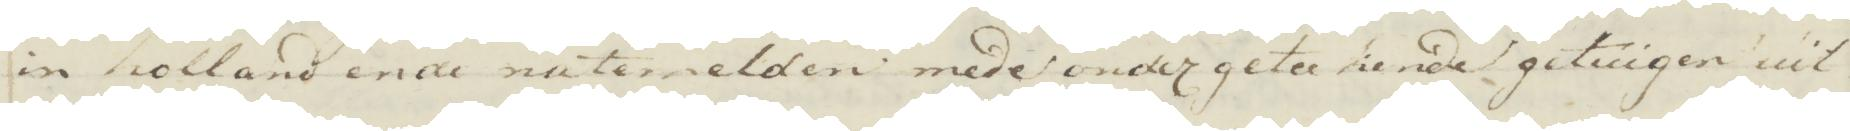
in holland en de natemelden mede ondergeteekende getuigen uit
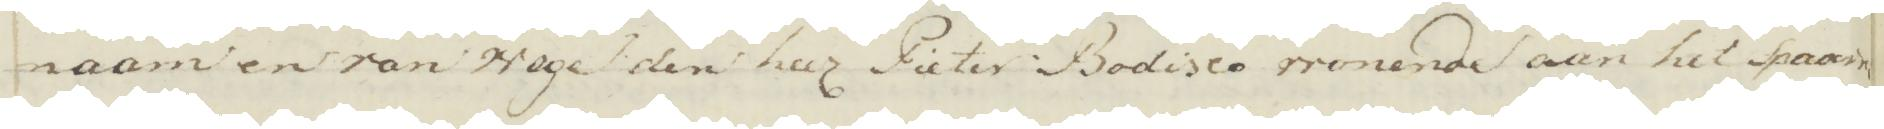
naam en van Wege den heer Pieter Bodisco wonende aan het spaarn
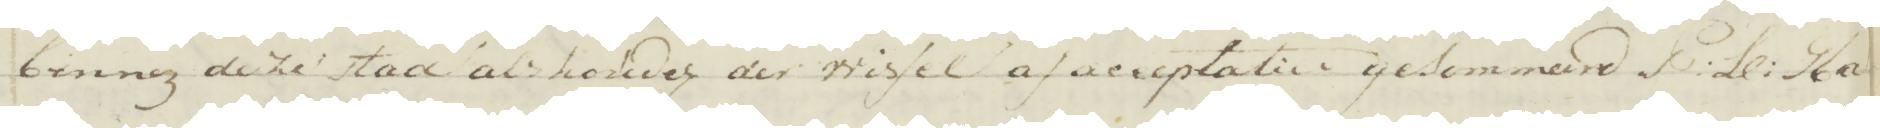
binnen deze stad als houder der wissel of acceptatie gesommeerd P: Le: Ha
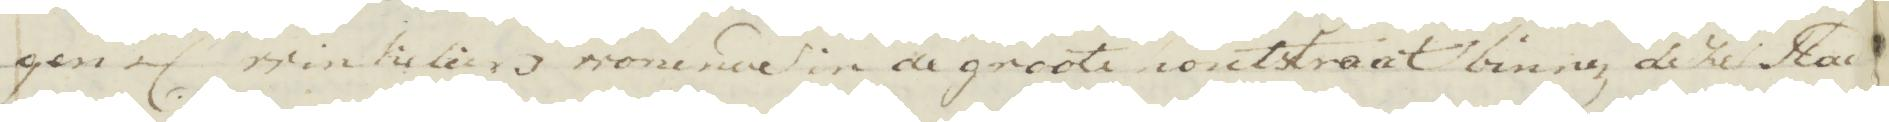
gen & C. winkeliers wonende in de groote houtstraat binnen deze stad
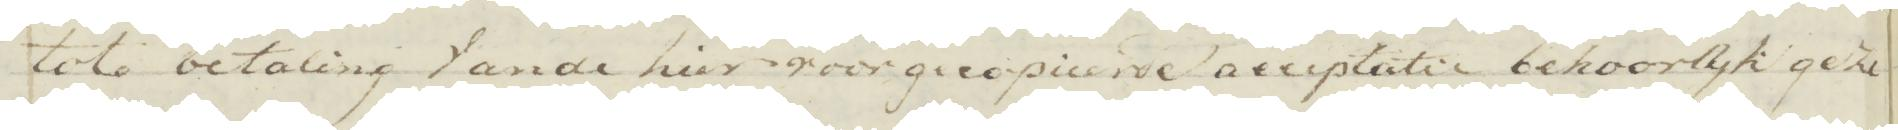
tot betaling vande hier voor gecopieerde acceptatie behoorlyk geze
